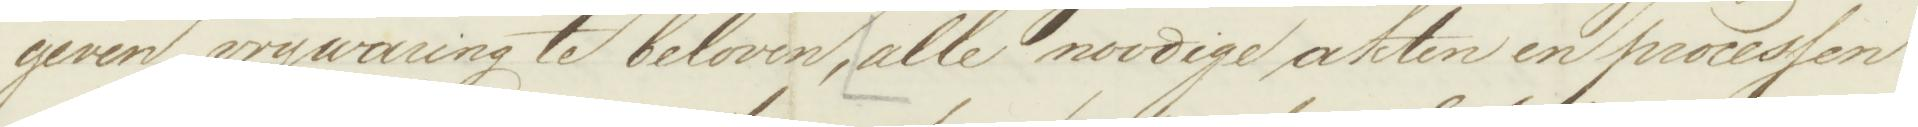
geven vrywaring te beloven, alle noodige akten en processen
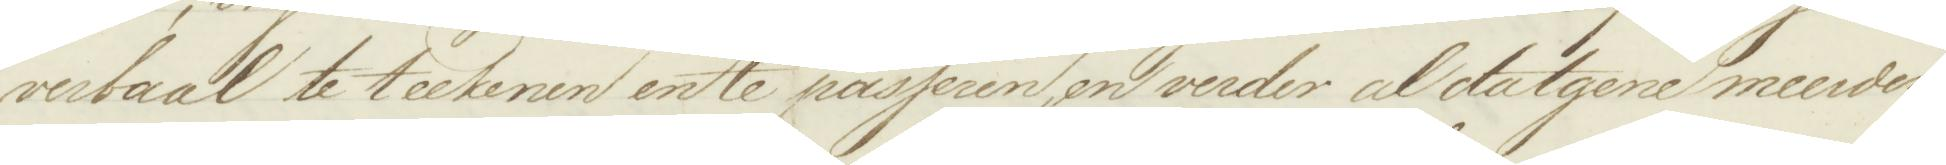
verbaal te teekenen en te passeren, en verder al datgene meerder
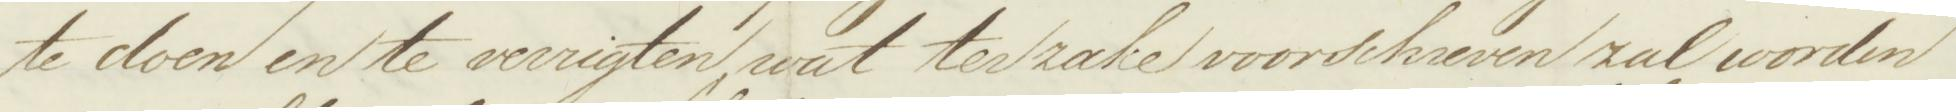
te doen en te verrigten, wat ter zake voorschreven zal worden
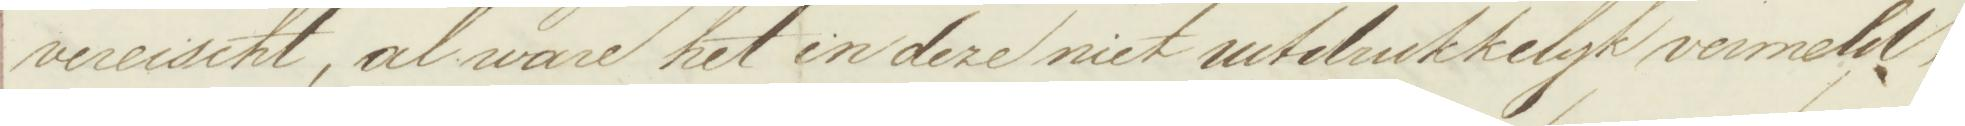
vereischt, al ware het in deze niet uitdrukkelyk vermeld,
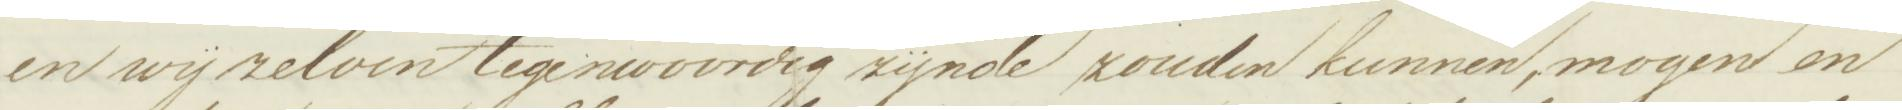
en wij zelven tegenwoordig zijnde zouden kunnen, mogen en
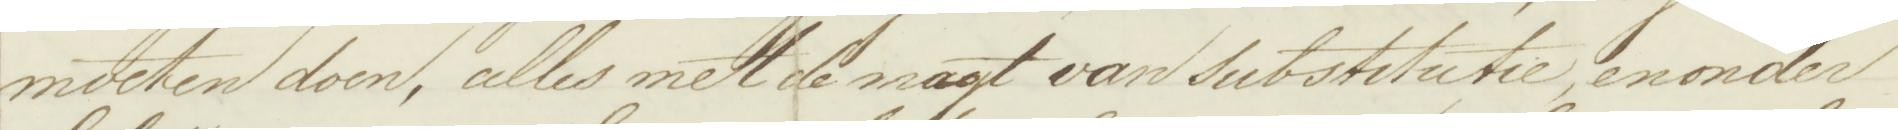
moeten doen, alles met de magt van substitutie en onder
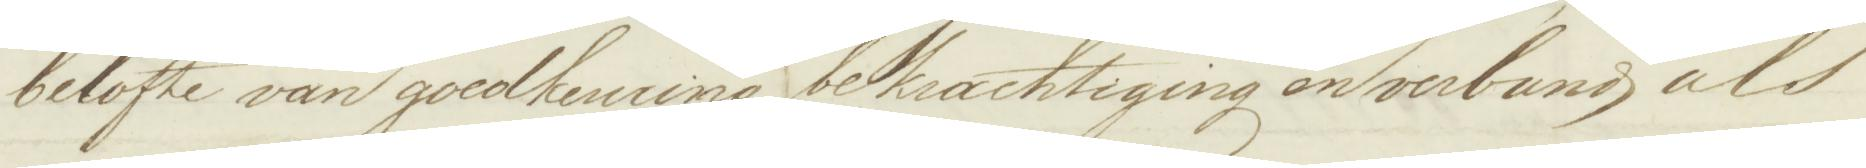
belofte van goedkeuring, bekrachtiging en verband, als
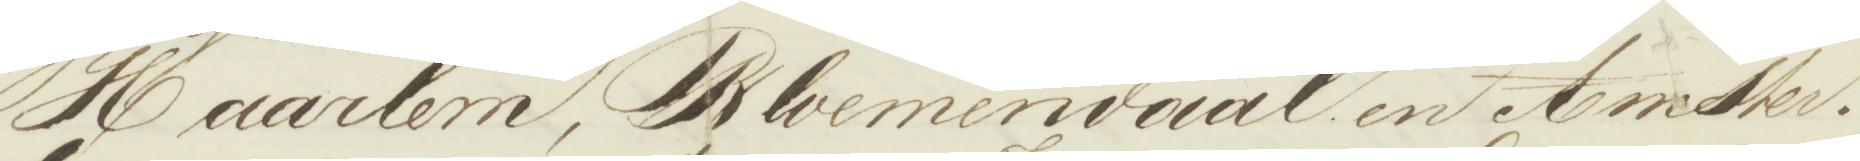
Haarlem, Bloemendaal, en Amster.
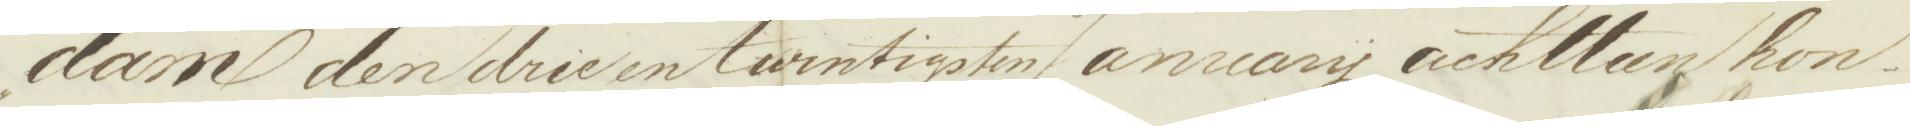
„dam den drie en twintigsten Januarij achttien hon„
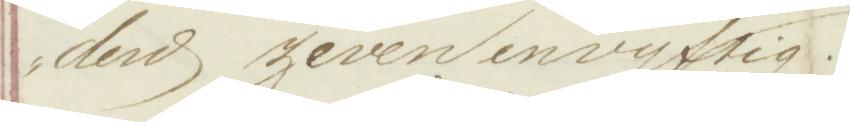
„derd zeven en vyftig.
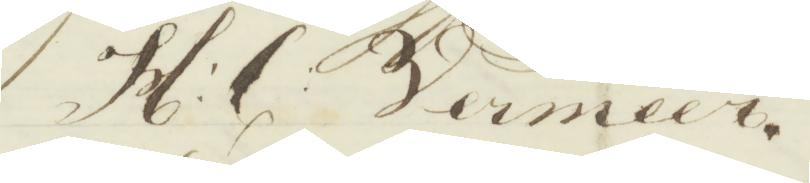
H:C: Vermeer
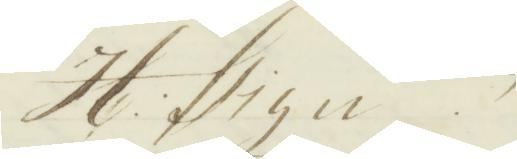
H: Hign.
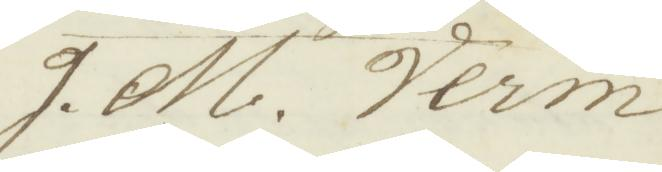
J. M. Vermeer
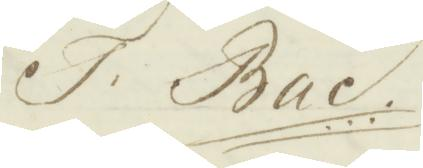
P: Bac
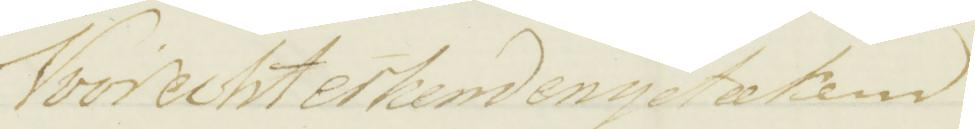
Voor echt erkend en geteekend
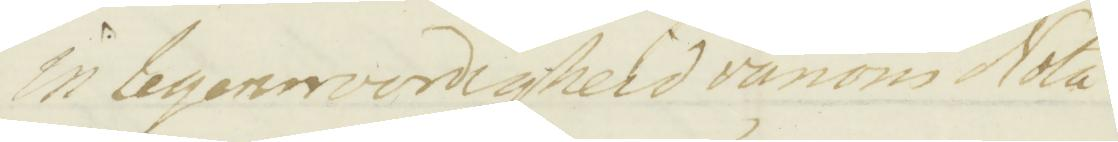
in tegenwoordigheid van ons Nota
